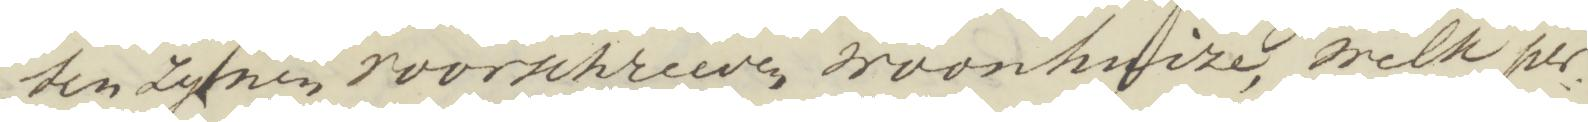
ten zynen voorschreeven woonhuize, welk per:
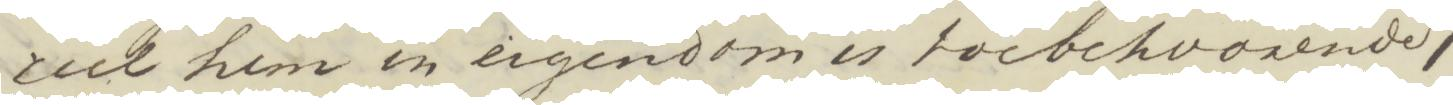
=ceel hem in eigendom is toebehoorende
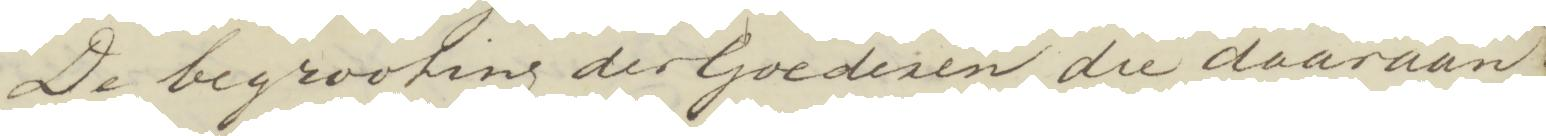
De begrooting der Goederen, die daaraan
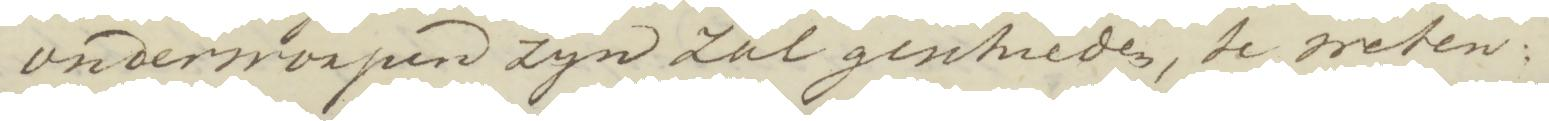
onderworpen zyn zal geschieden, te weten:
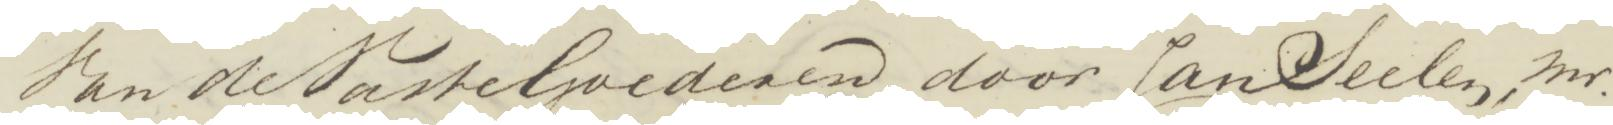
Van de Vaste Goederen, door Jan Seelen, mr.
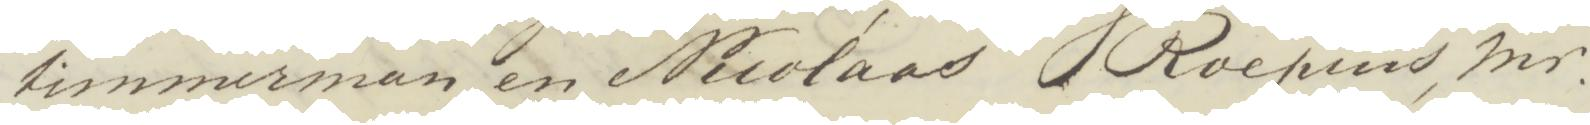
timmerman, en Nicolaas Roepius, mr.
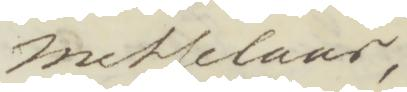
metselaar,
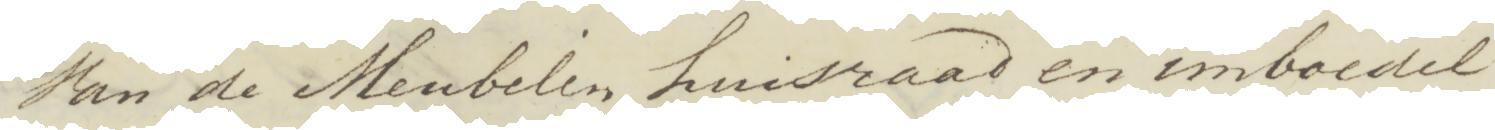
Van de Meubelen, huisraad en imboedel
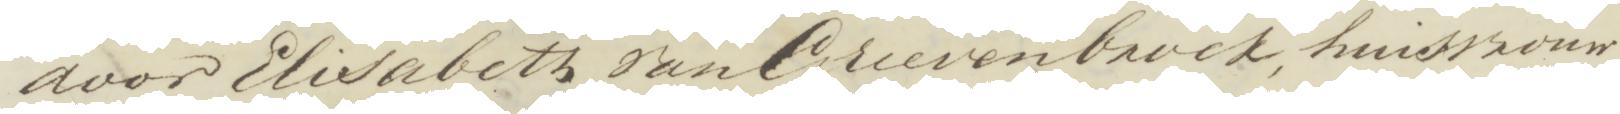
door Elisabeth van Greevenbroek, huisvrouw
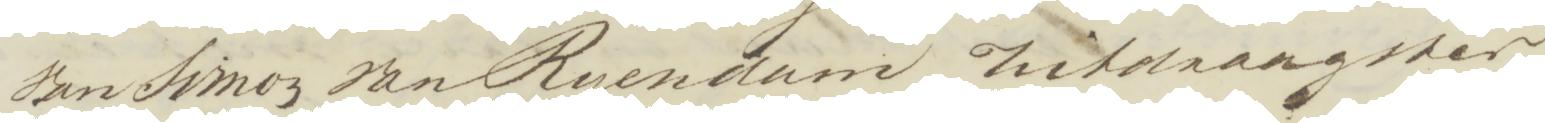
van Simon van Ryendam, uitdraagster,
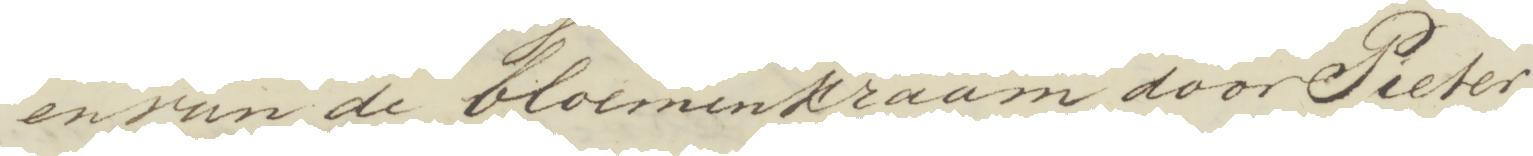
en van de bloemenkraam door Pieter
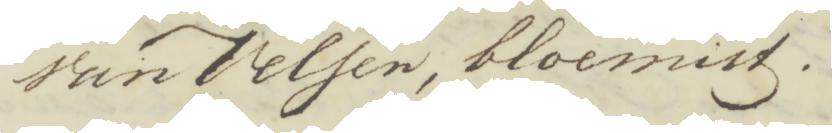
van Velsen, bloemist.
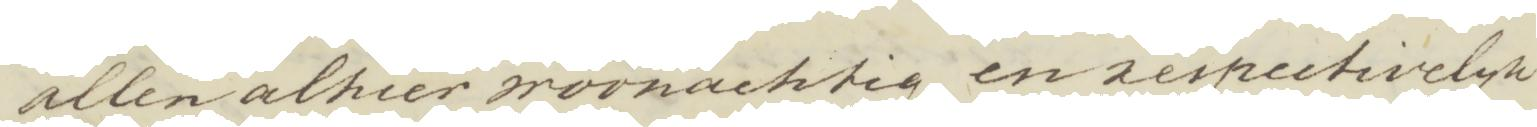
allen alhier woonachtig, en respectivelyk
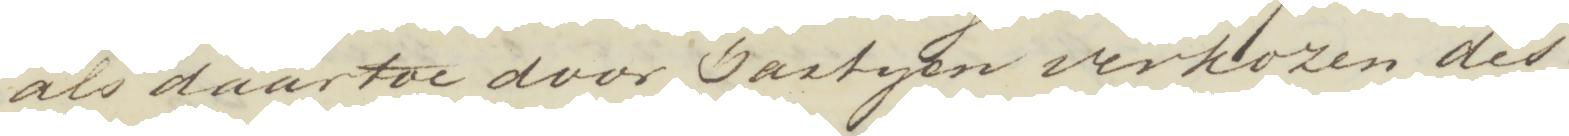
als daartoe door partyen verkozen des:
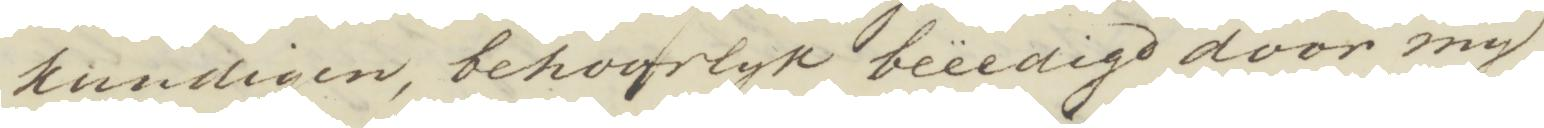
=kundigen, behoorlyk beëedigd door my
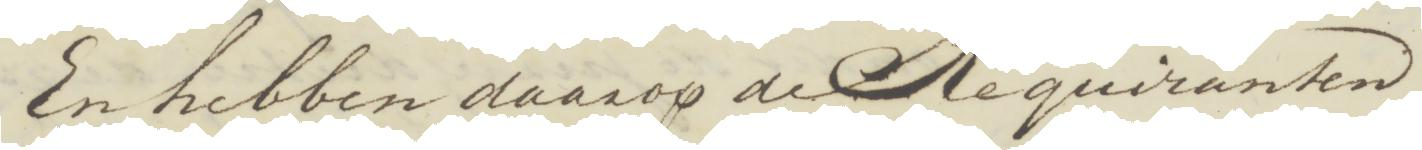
En hebben daarop de Requiranten
